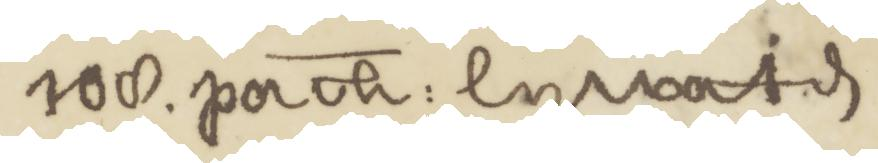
108. pack: lywaten
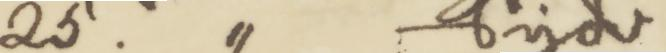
25. „ sijde
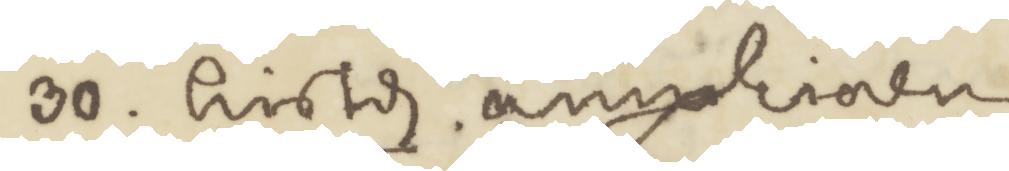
30. kisten amphioen
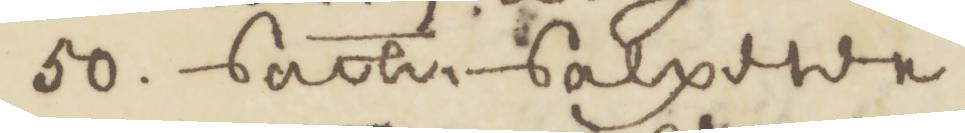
50. sack. salpeter
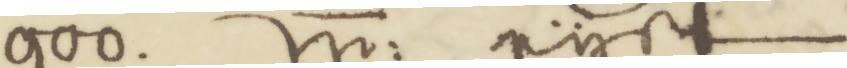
900. m: rijst
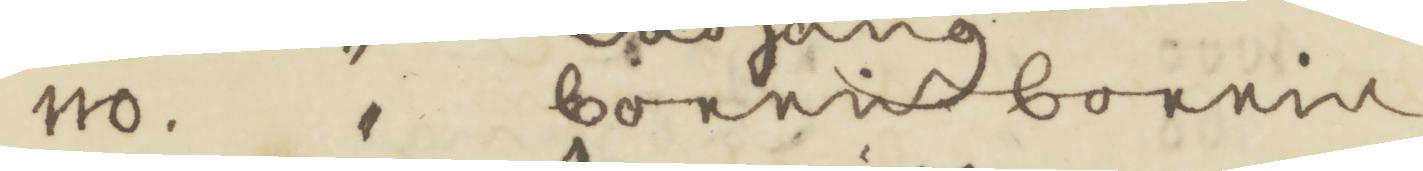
110. „ borrie borrie
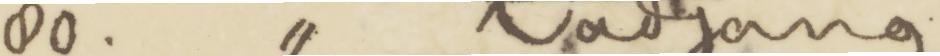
80. „ Cadjang
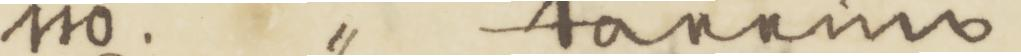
110. „ tarruw
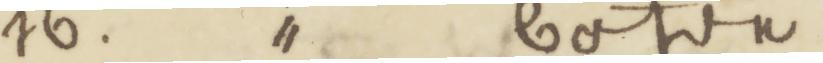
16. „ boter
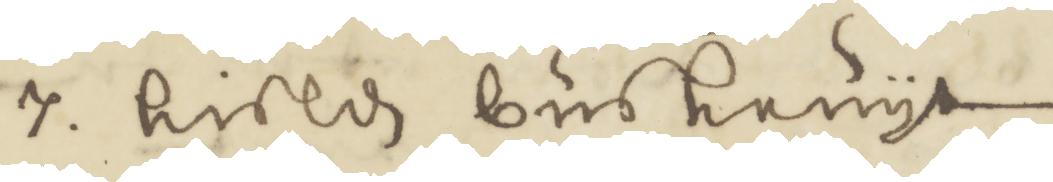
7. kisten buskruijt
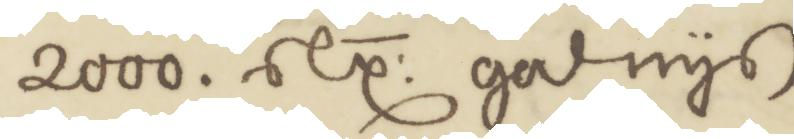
2000. stx: goenijs
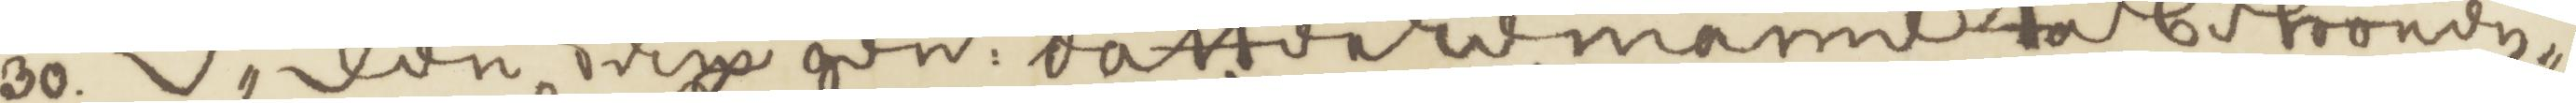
30. D„o Een schip gen:t batterhemanie toebehoren„
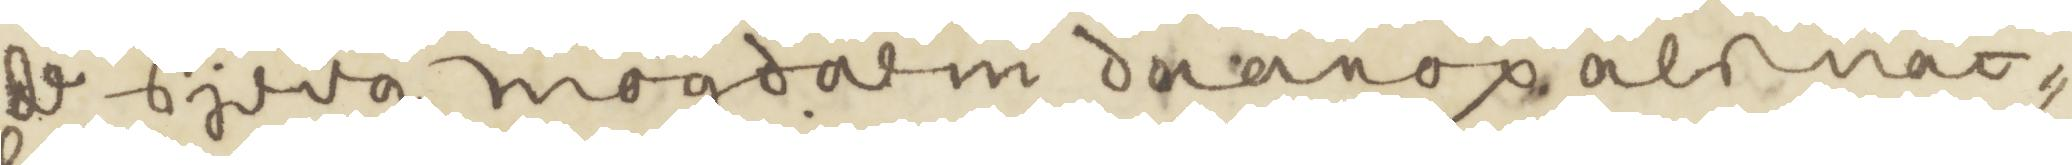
de sjeeg Mogdoem daarop als nac„
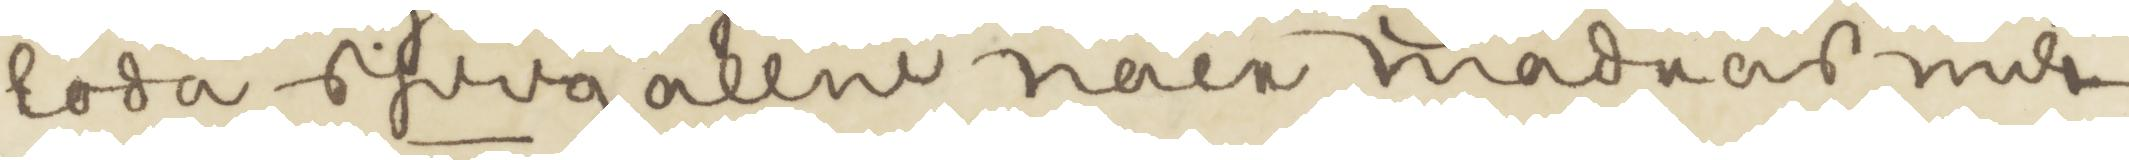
hoda sjeeg allie naer Madras met
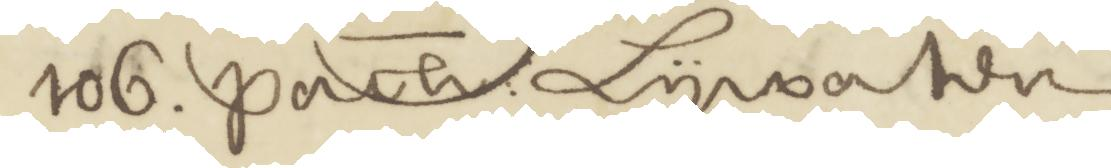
106. pack: Lijwaten
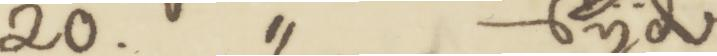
20. „ sijde
